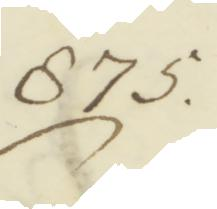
875.
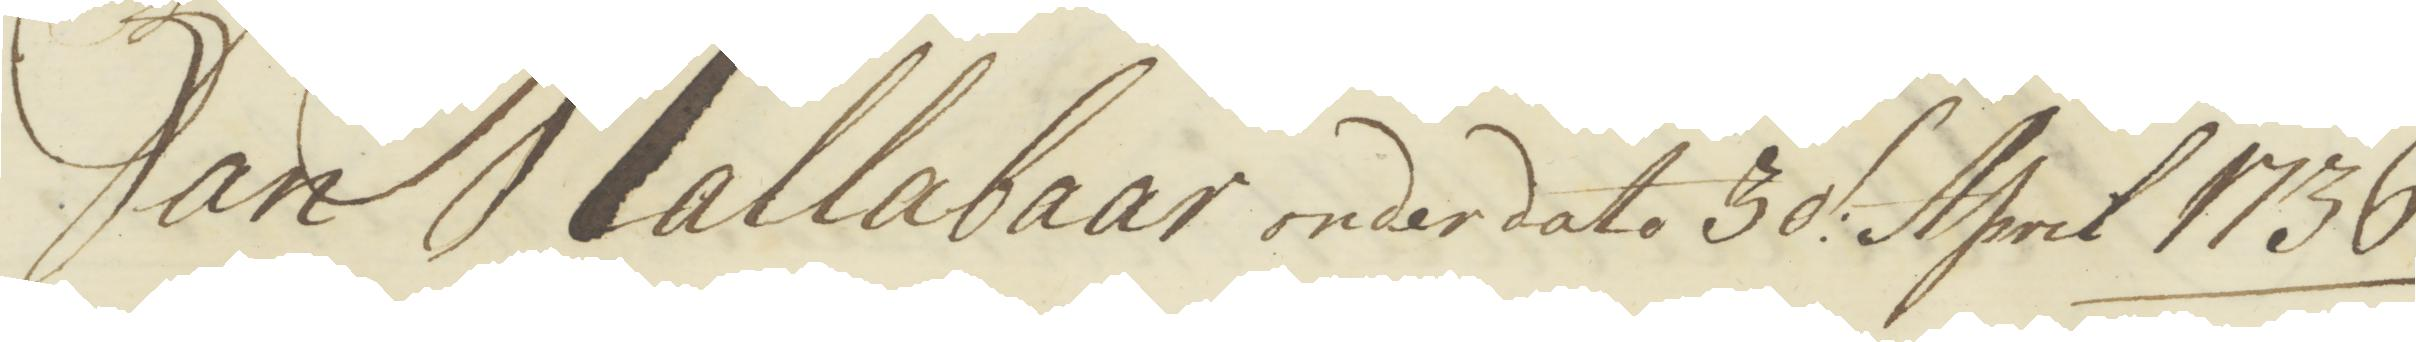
Van Mallabaar onder dato 30:' April 1736
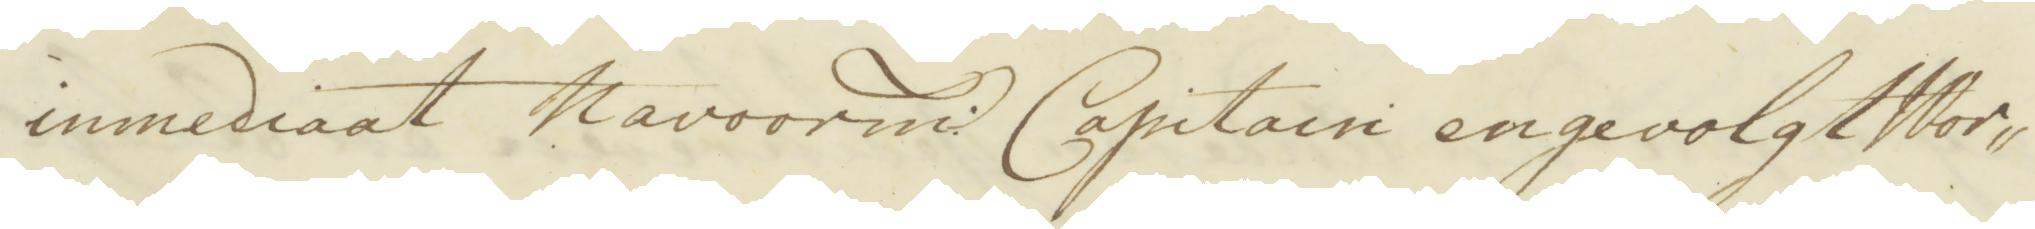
inmediaat navoorm: Capitain en gevolgt wor„
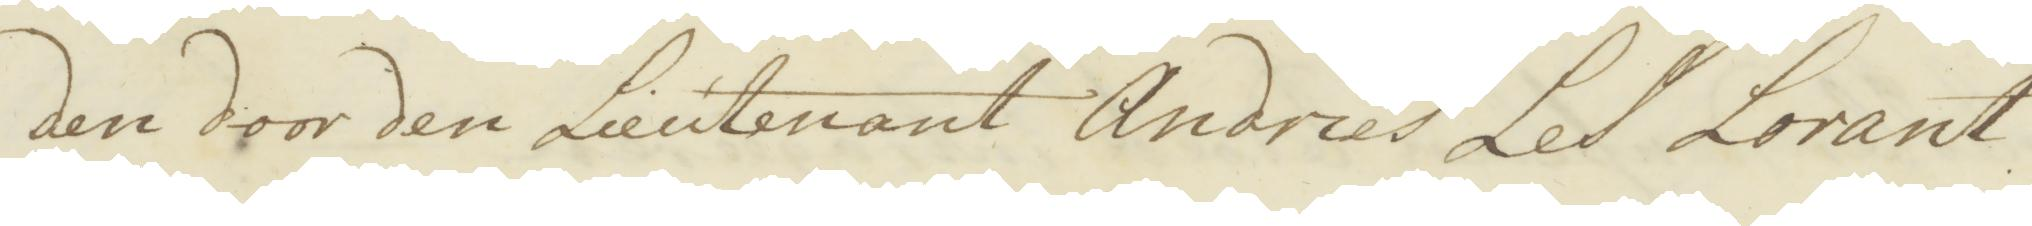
den door den Lieutenant Andries Les Lorant
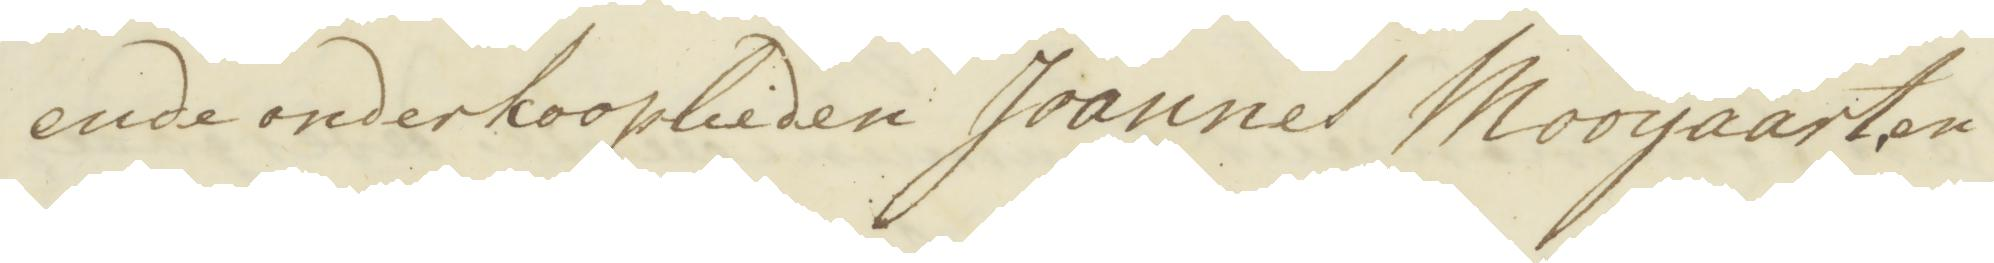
ende onderkooplieden Joannes Mooijaart,en
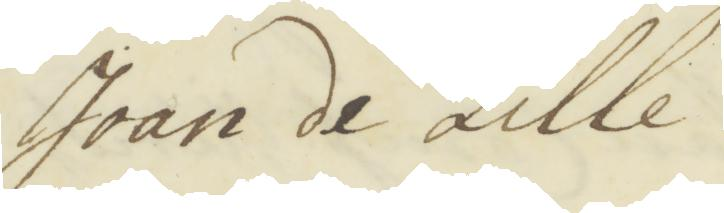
Joan de Lille
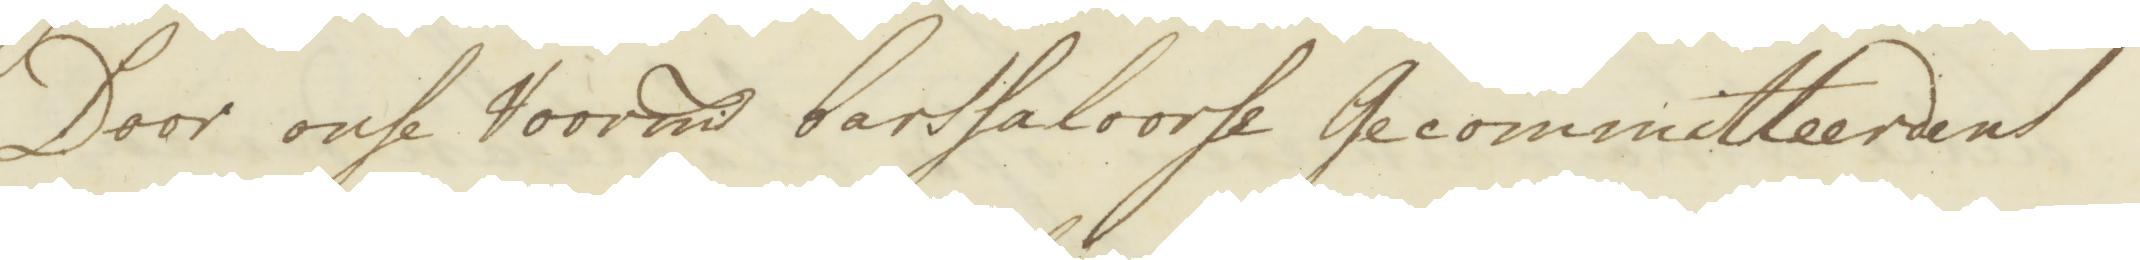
Door onse voorm: barssaloorse gecommitteerdens
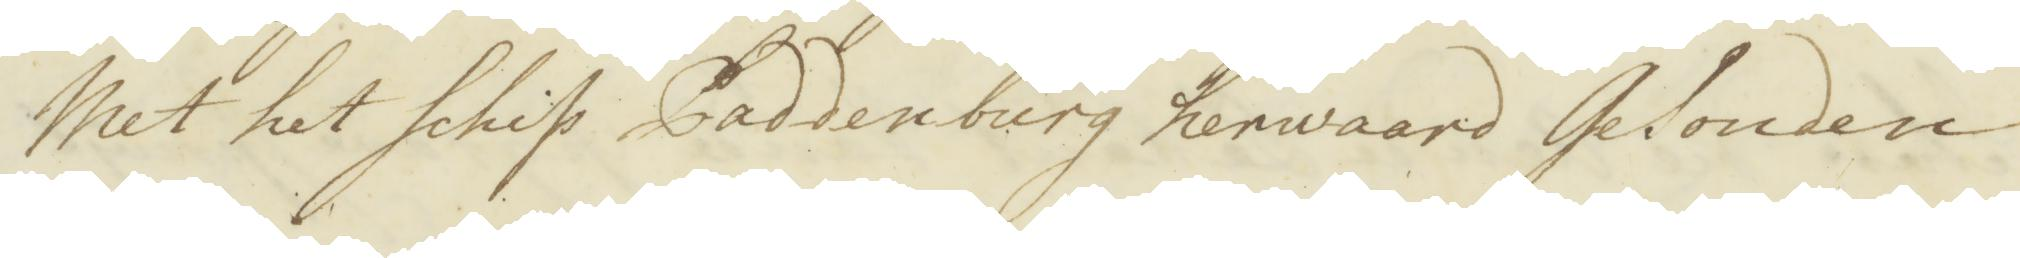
met het schip Paddenburg herwaard gesonden
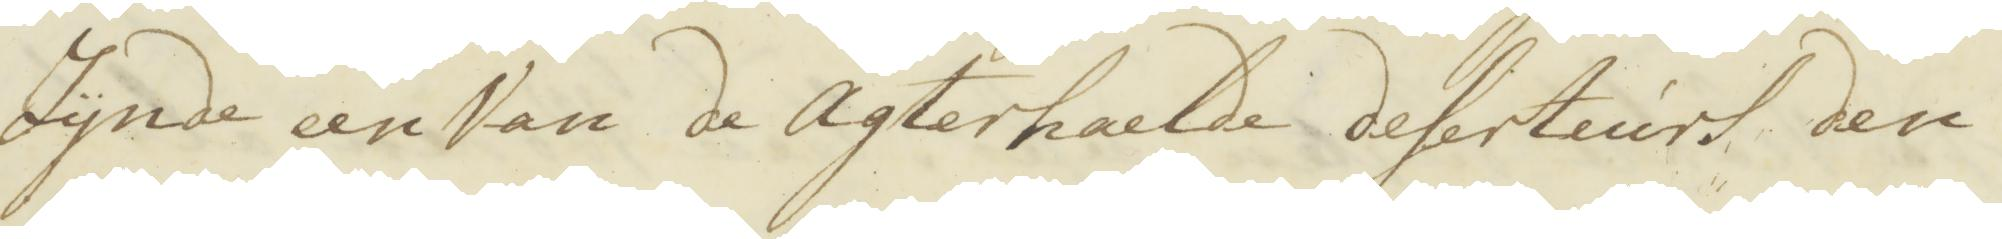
zijnde een van de Agterhaelde deserteurs den
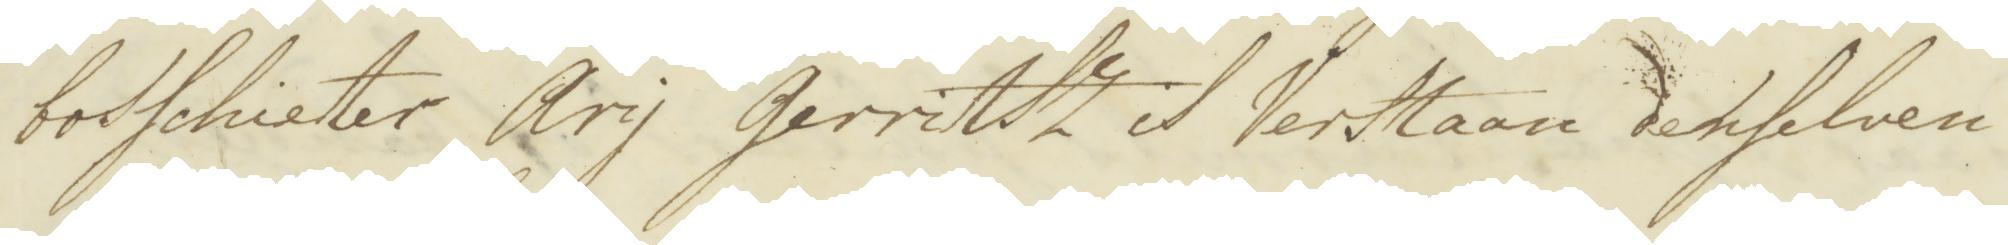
bosschieter Arij Gerritsz is verstaan denselven
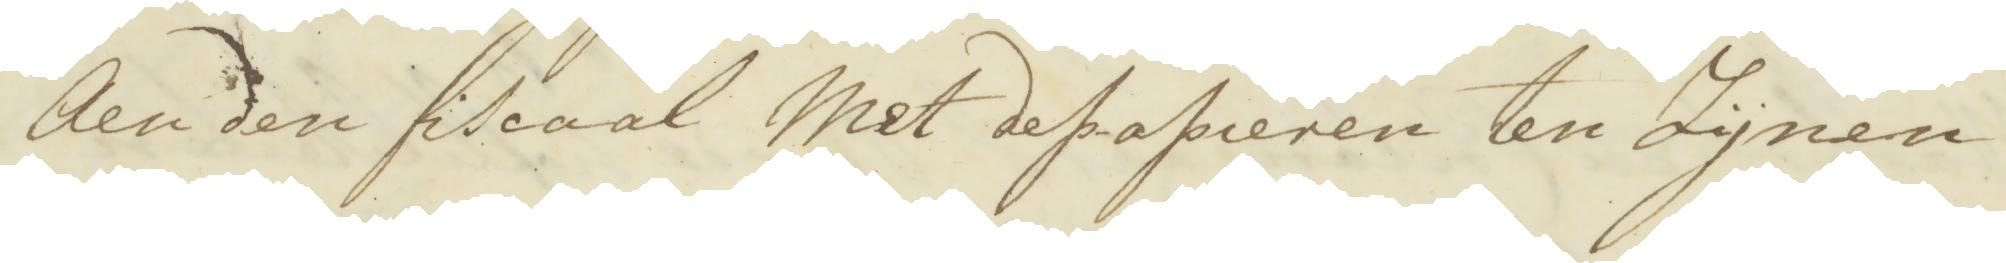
aen den fiscaal met depapieren ten zijnen
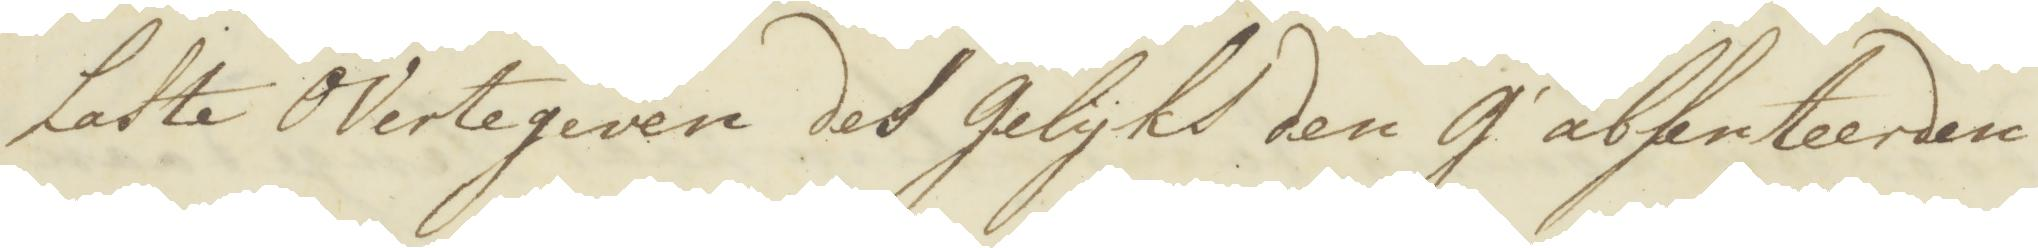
laste overtegeven des gelijks den g' absenteerden
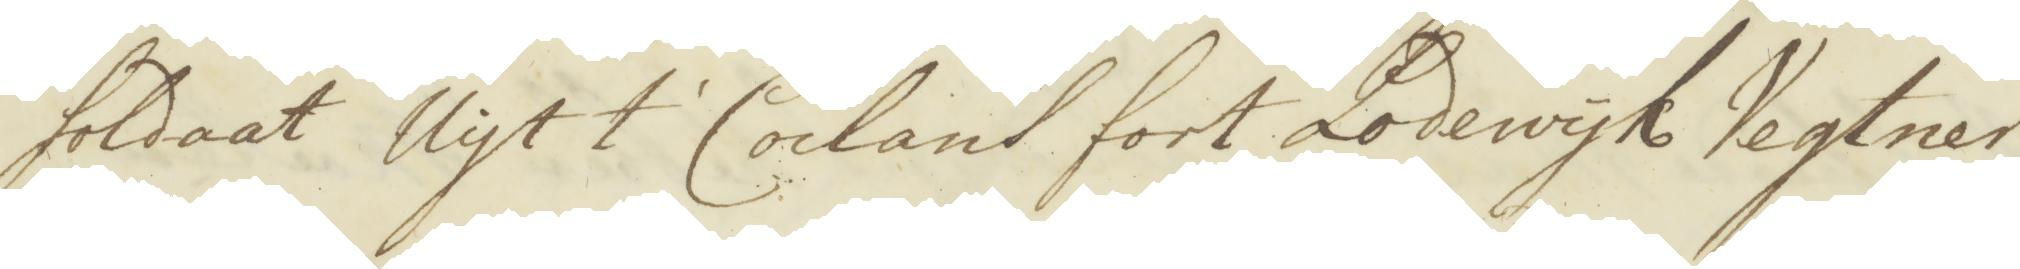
soldaat Uijt t' Coilans fort Lodewijk Vegtner
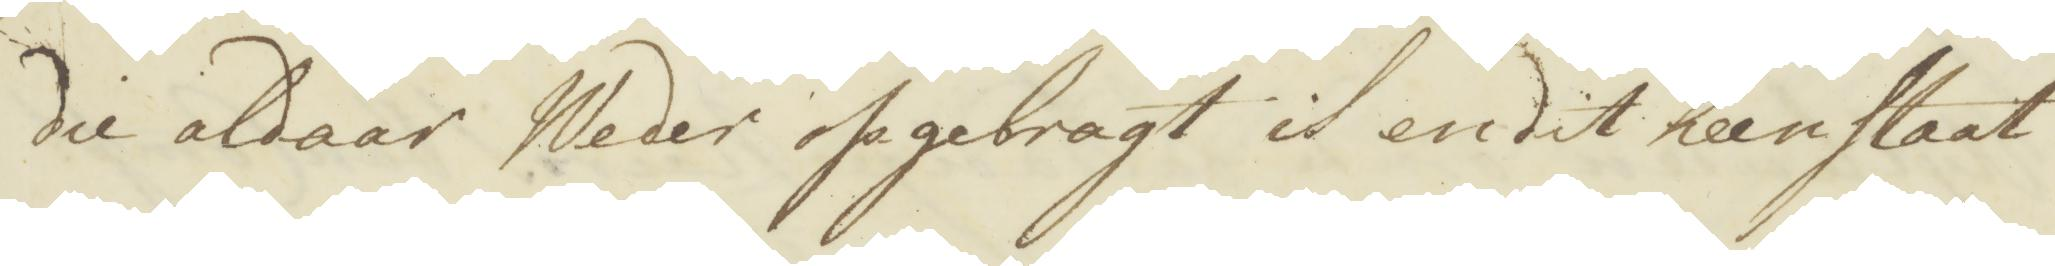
die aldaar weder opgebragt is en dit heen staat
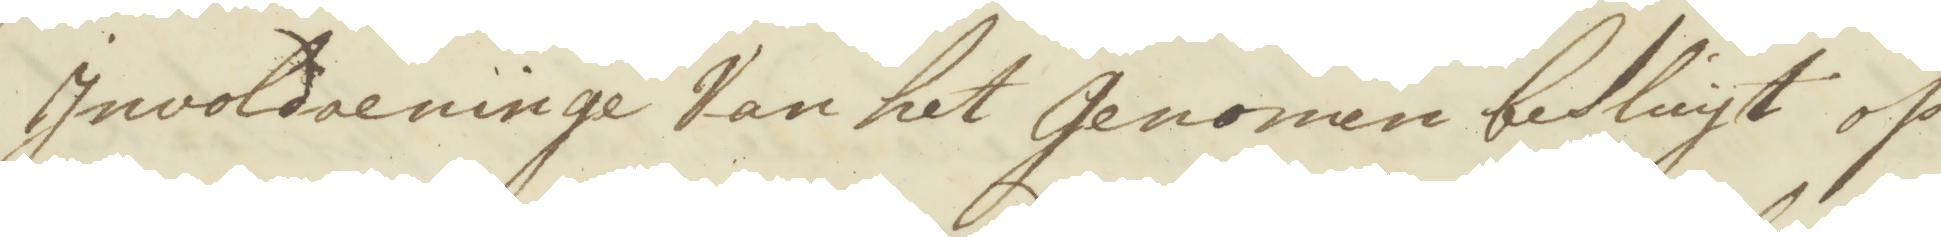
Jnvoldoeninge van het genomen besluijt op
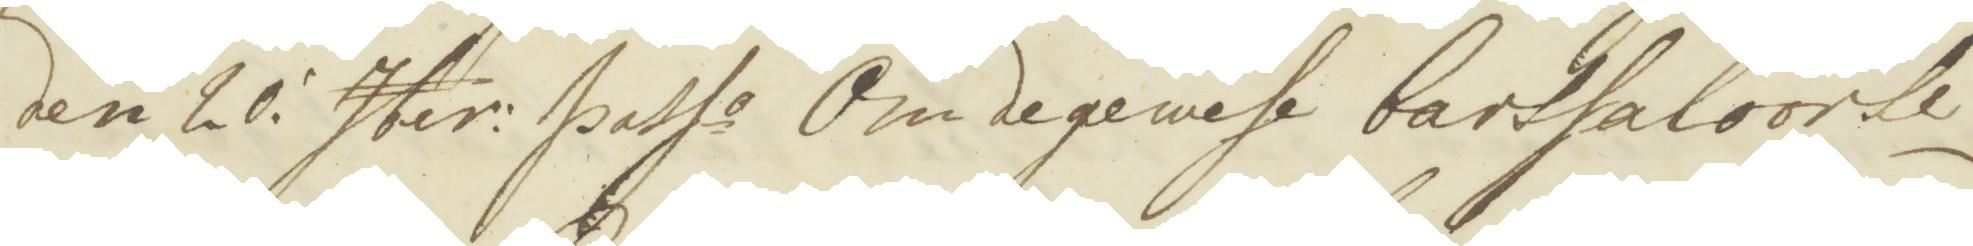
den 20: Jber: pass=o Om degewese barssaloorse
